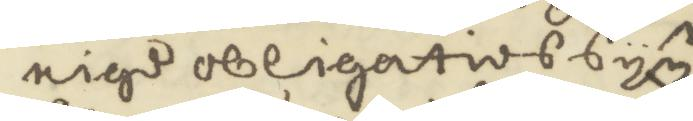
rige obligaties sijn
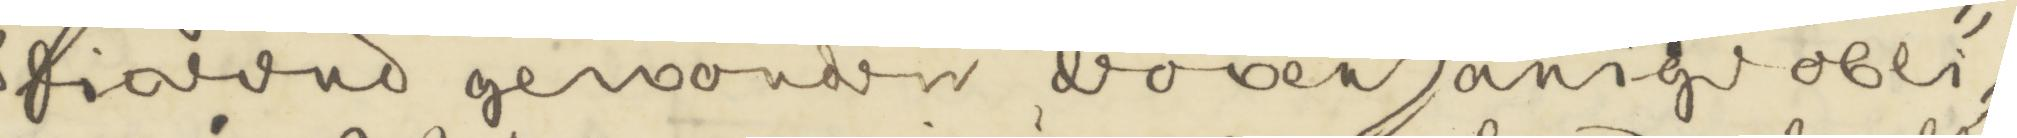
ficeerd geworden de overjarige obli„
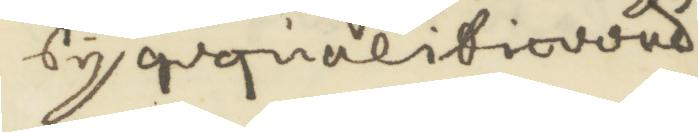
bij gequalificeerd
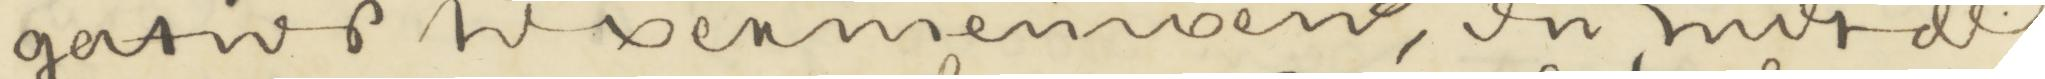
gaties te vernieuwen, en met de
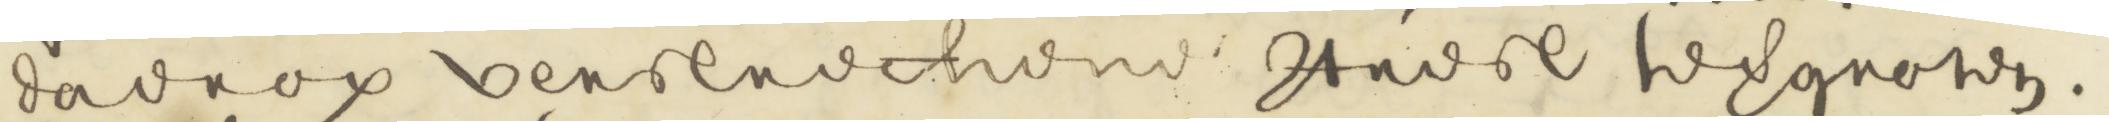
daerop verstreckene jtrest tevergroten.
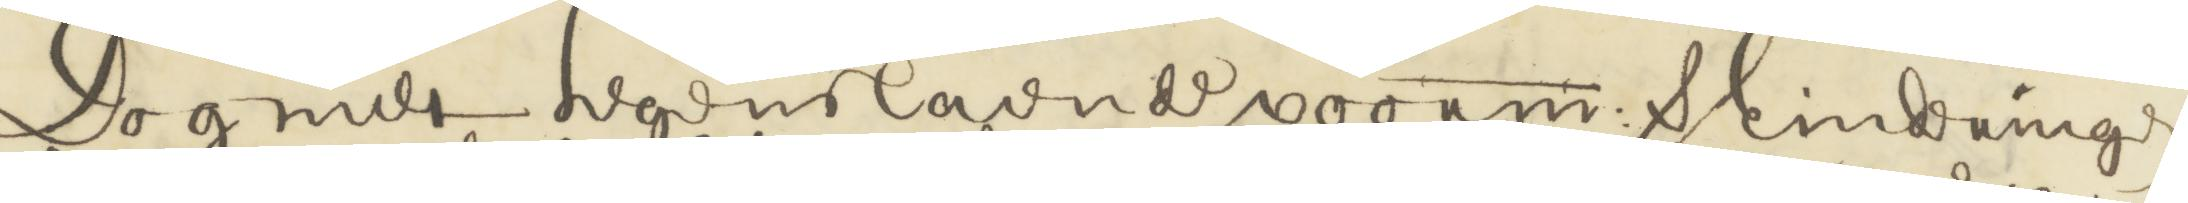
Dog niet tegenstaende voorm: verhinderingen
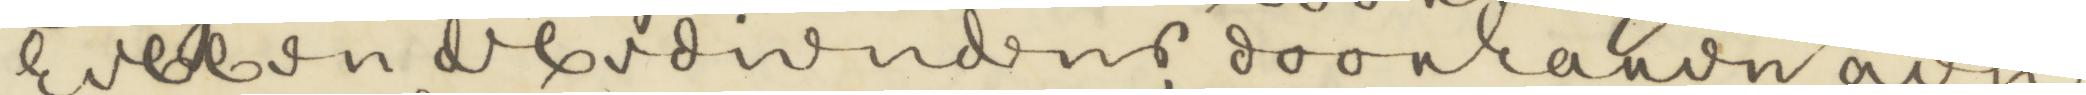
hebben de bediendens door haren aen„
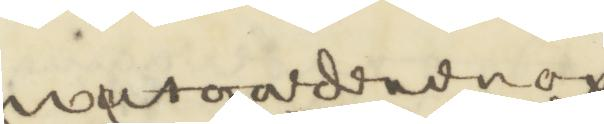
wat goederen op
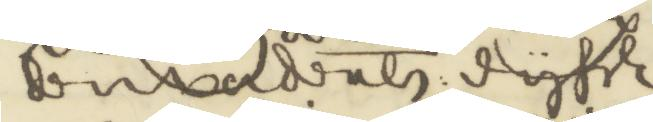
de in vaderlijk eijsch
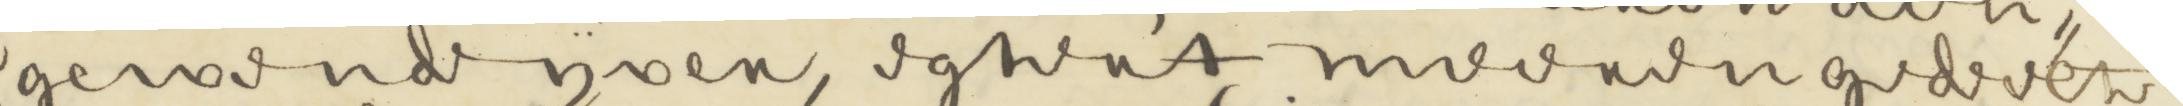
gewende ijver egter't meeren gedeelte
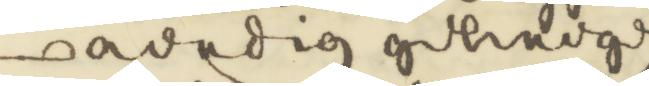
vaerdig gekregen
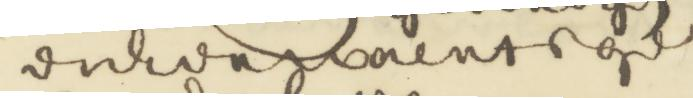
en herwaerts ge
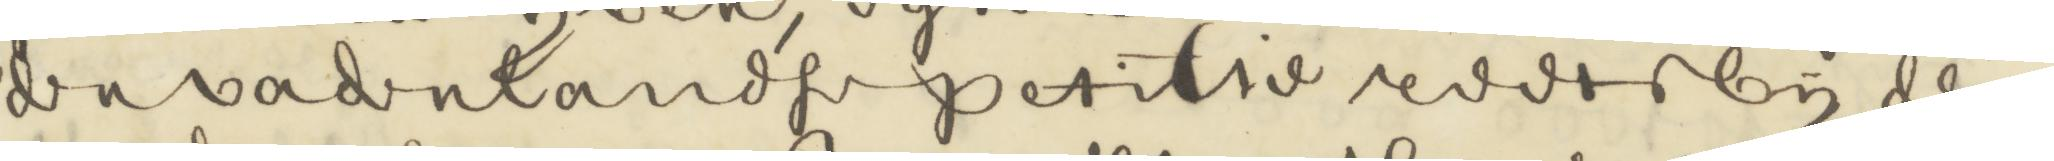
der vaderlandse petitie reets bij den
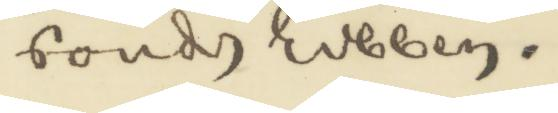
souden hebben.
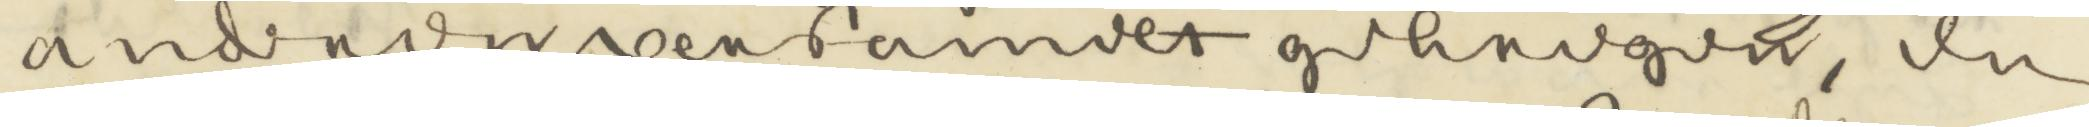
anderen versamelt gekregen, en
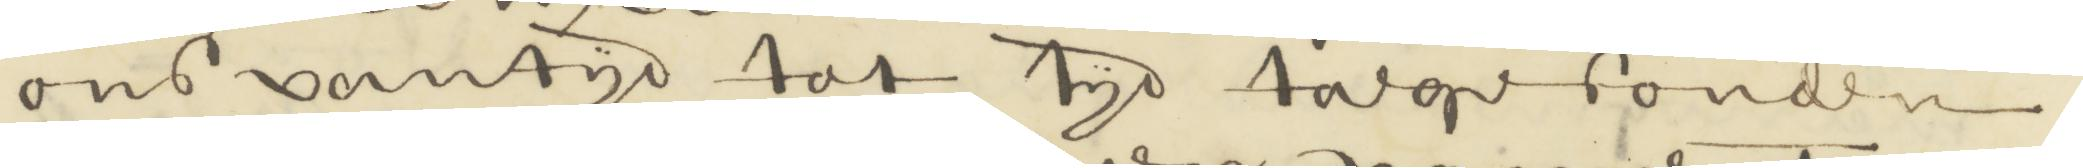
ons van tijd tot tijd toegesonden
